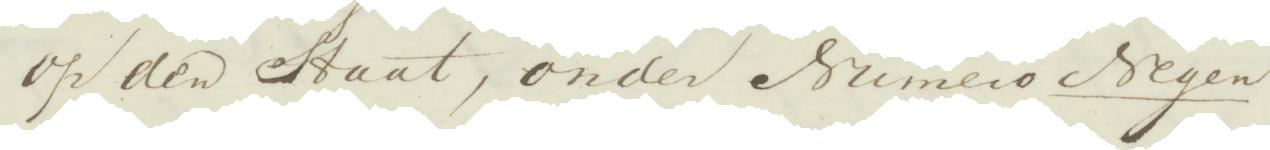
op den Staat, onder Numero Negen
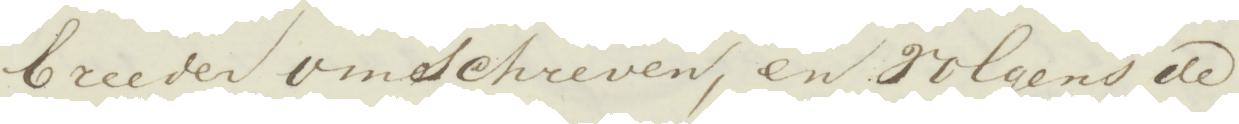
breeder omschreven, en volgens de
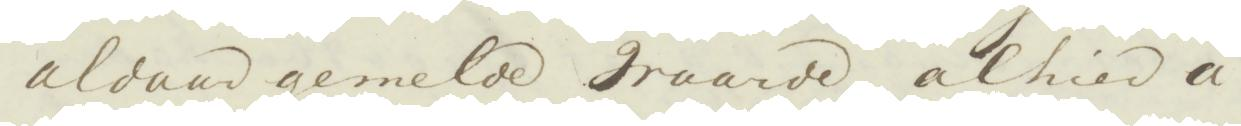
aldaar gemelde waarde alhier a
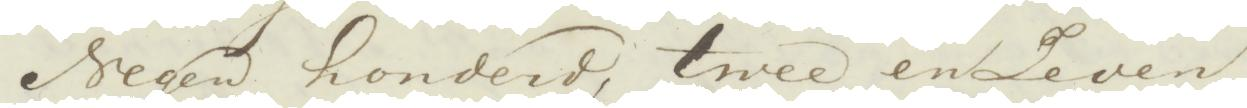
Negen honderd, twee en Zeven
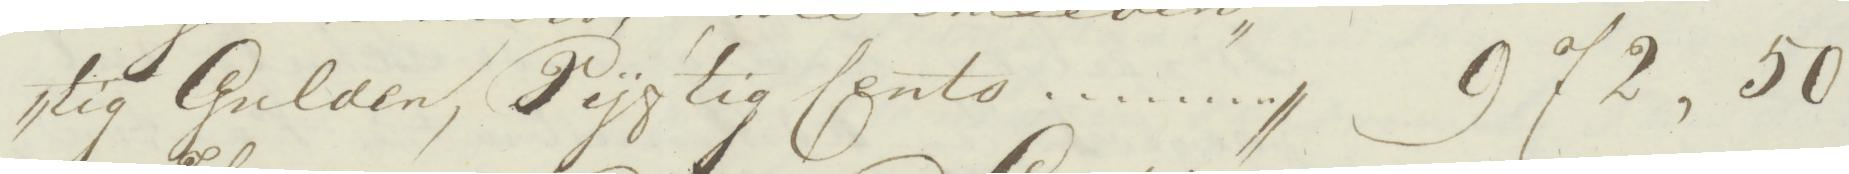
„tig Gulden, Vijftig Cents . . . . . . . . . „ 972, 50
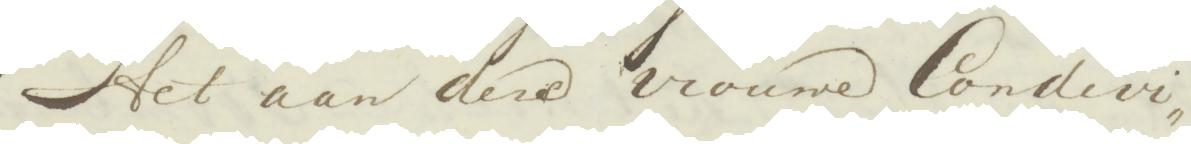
Het aan deze vrouwe Condivi„
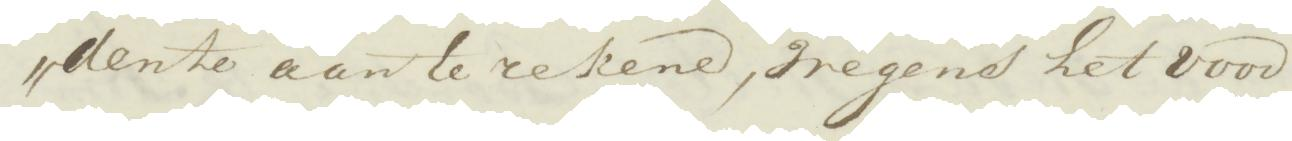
„dente aan te rekene, wegens het voor
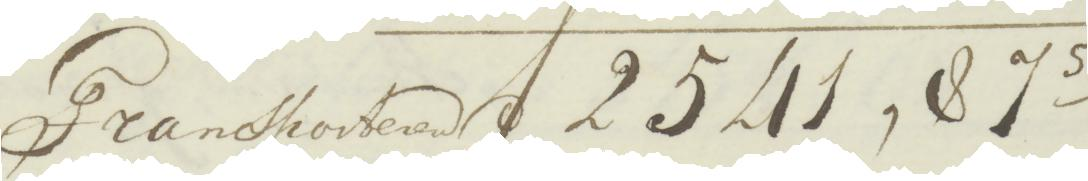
Transporteren ƒ 2541 ,87 /5
